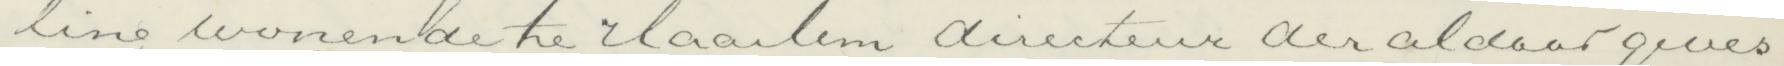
ling, wonende te Haarlem, directeur der aldaar geves
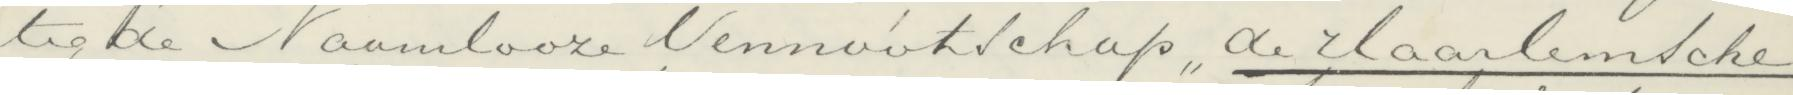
tigde Naamlooze Vennootschap „ de Haarlemsche
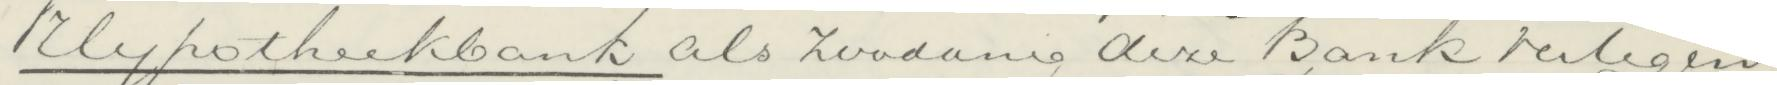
Hypotheekbank als zoodanig deze Bank vertegen
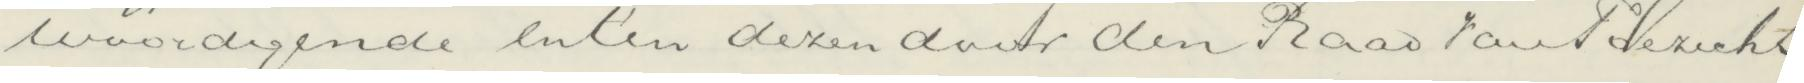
woordigende enten dezen door den Raad van toezicht
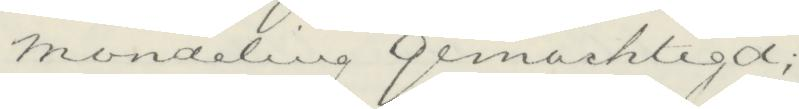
mondeling Gemachtigd;
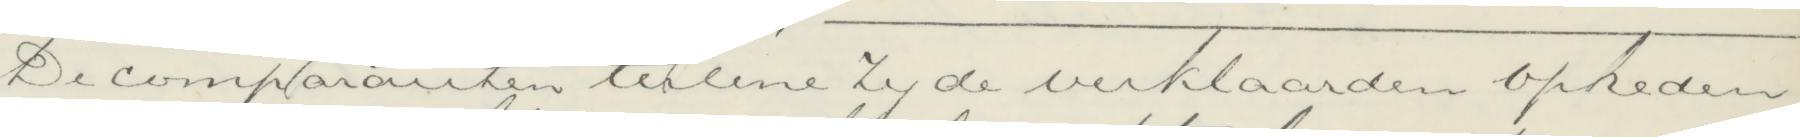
De comparanten ter eene zyde verklaarden opheden
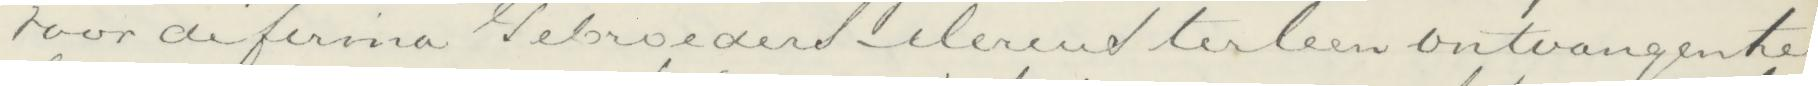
voor de firma Gebroeders Merens ter leen ontvangen te
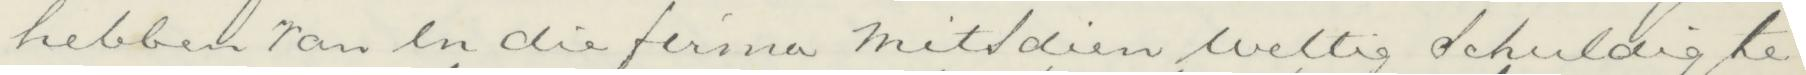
hebben van en die firma mitsdien, wettig schuldig te
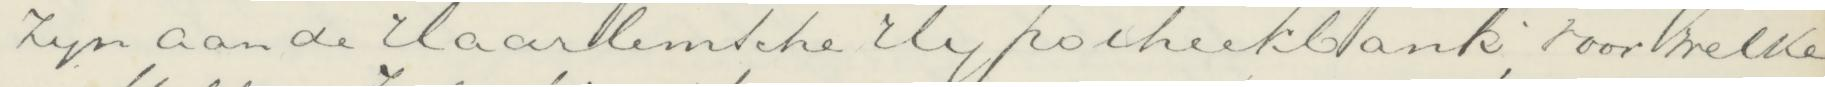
zyn aan de Haarlemsche Hypotheekbank voor welke
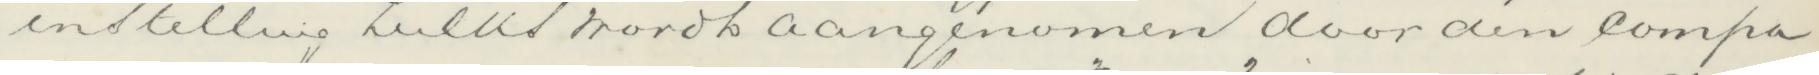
instelling zulks wordt aangenomen door den compa
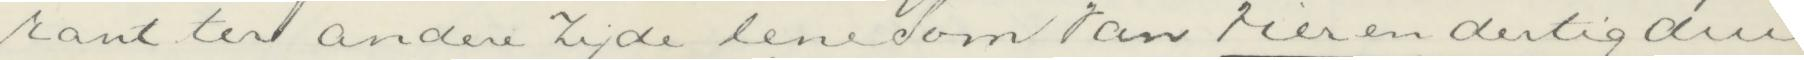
rant ter andere zijde eene som van vier en dertig dui
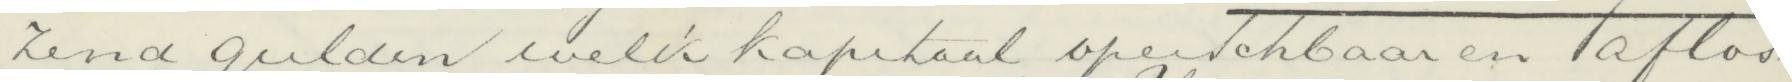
zend gulden, welk kapitaal openschbaar en aflos,
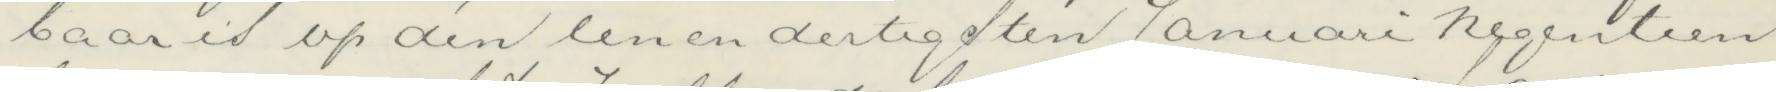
baar is op den een en dertigsten Januari Negentien
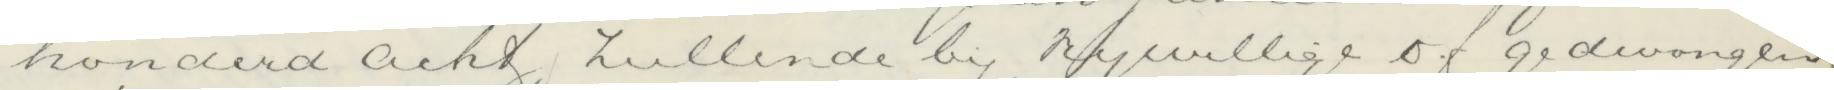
honderd acht, zullende bij vrywillige of gedwongen
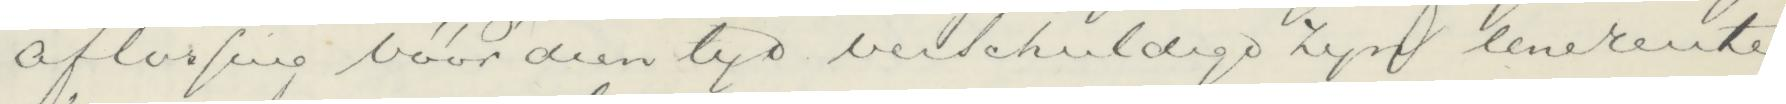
aflossing voor dien tyd verschuldigd zyn eene rente
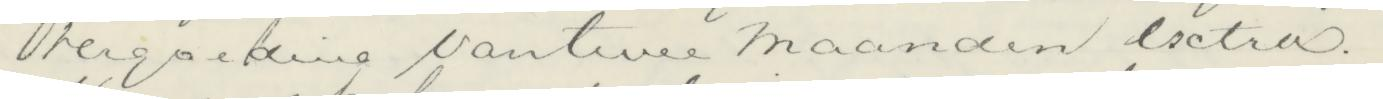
vergoeding van twee maanden extra.
